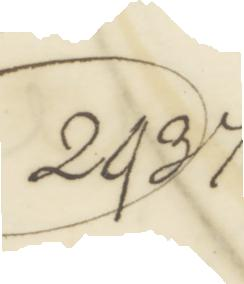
2437
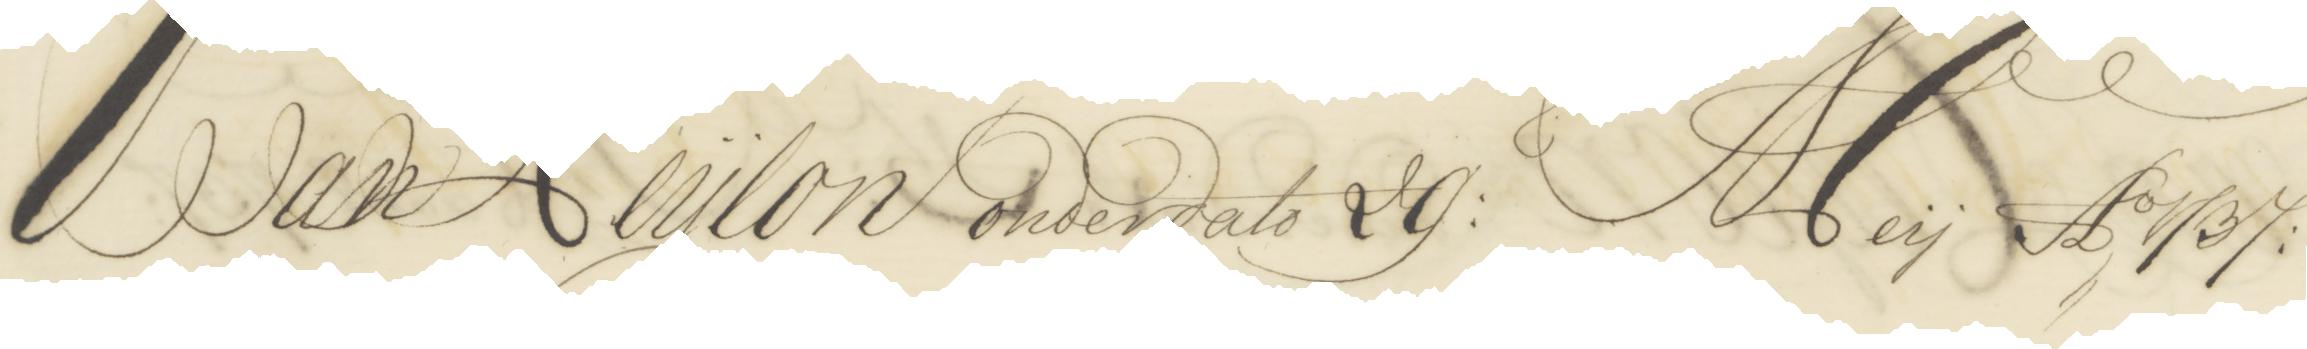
Van Ceijlon onderdato 29': Meij A„o 1737:
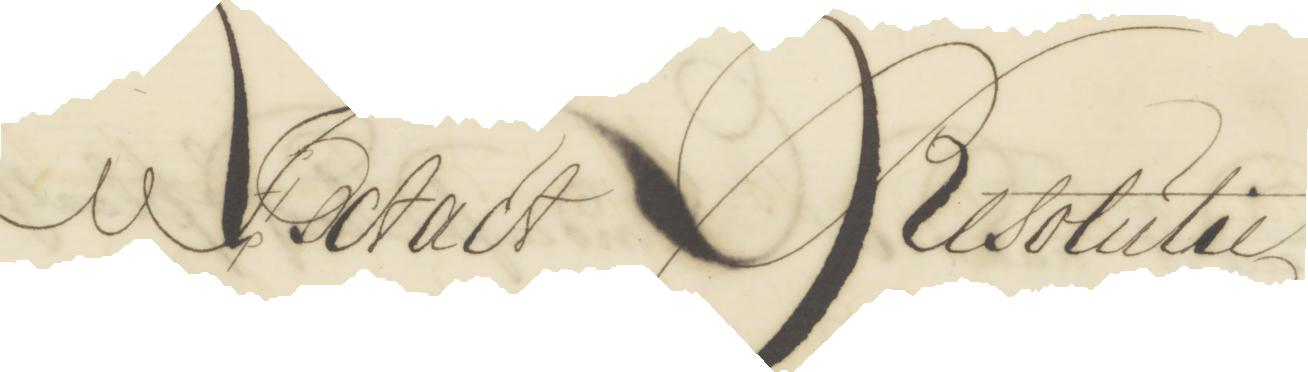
Extact Resolutie
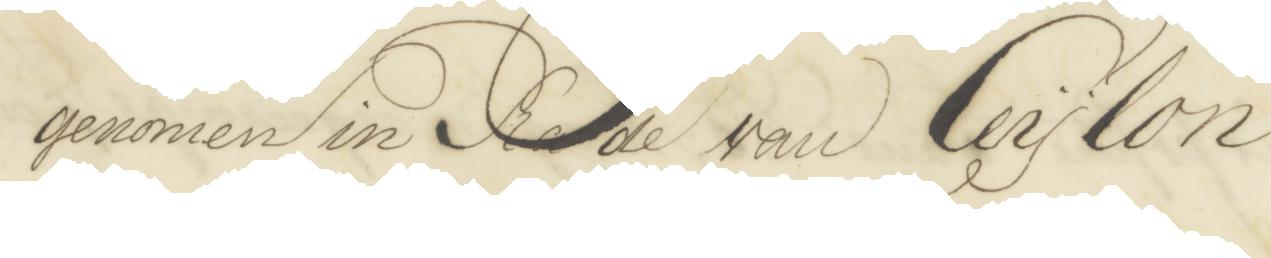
genomen in Rade van Ceijlon
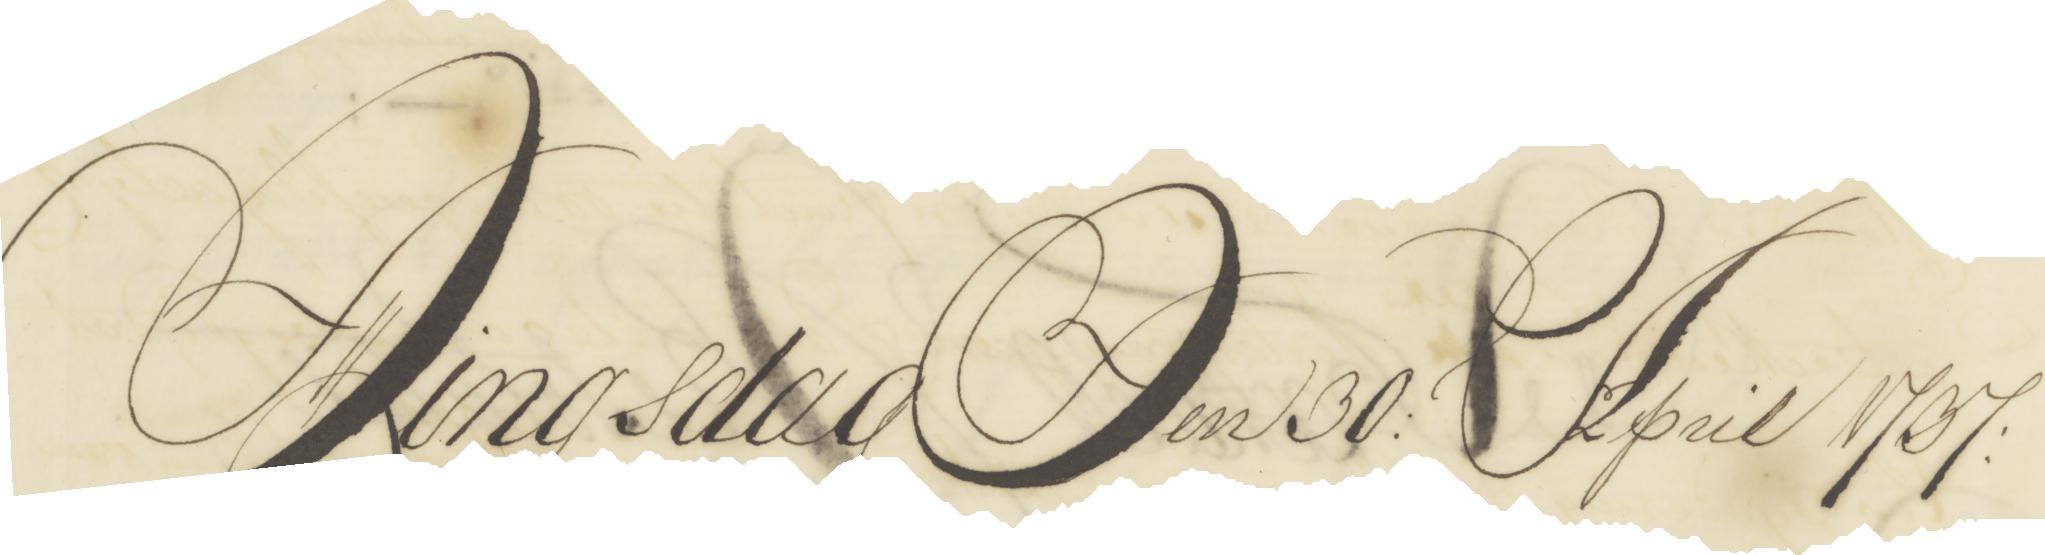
Dingsdag Den 30:; April 1737:
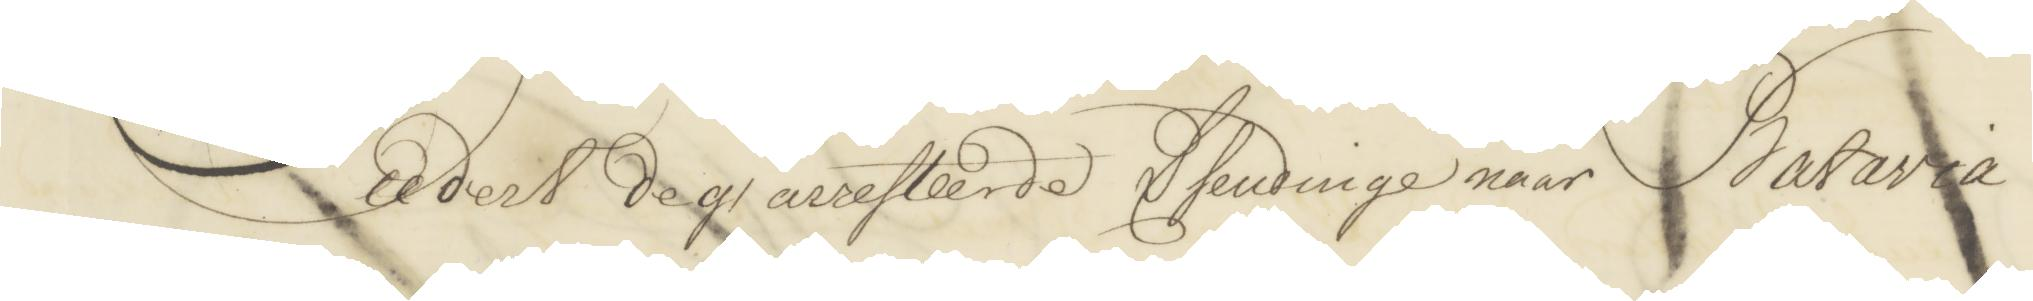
Seedert de garresteerde versendinge naar Batavia
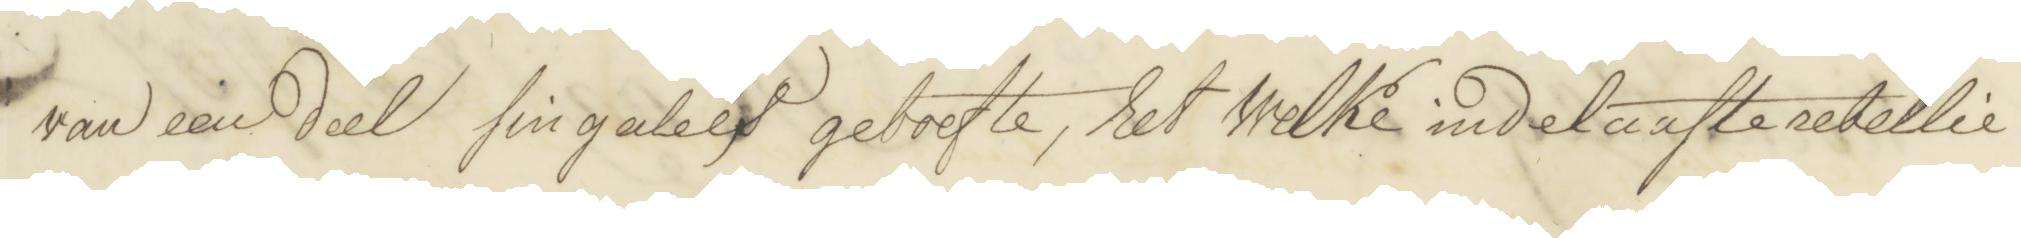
van een deel singalees geboefte, het welke indelaaste rebellie
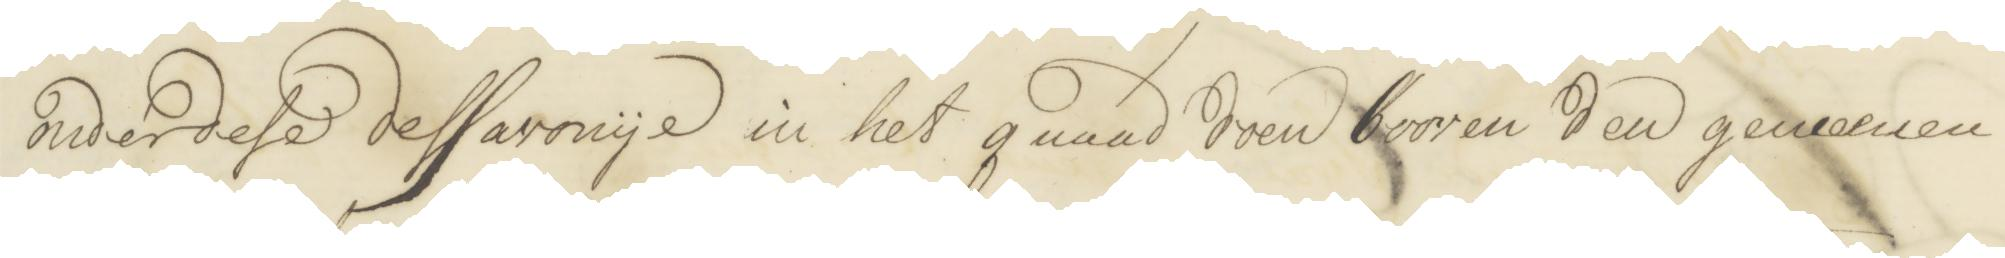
onderdese dessavonije in het quaad doen boven den gemeenen
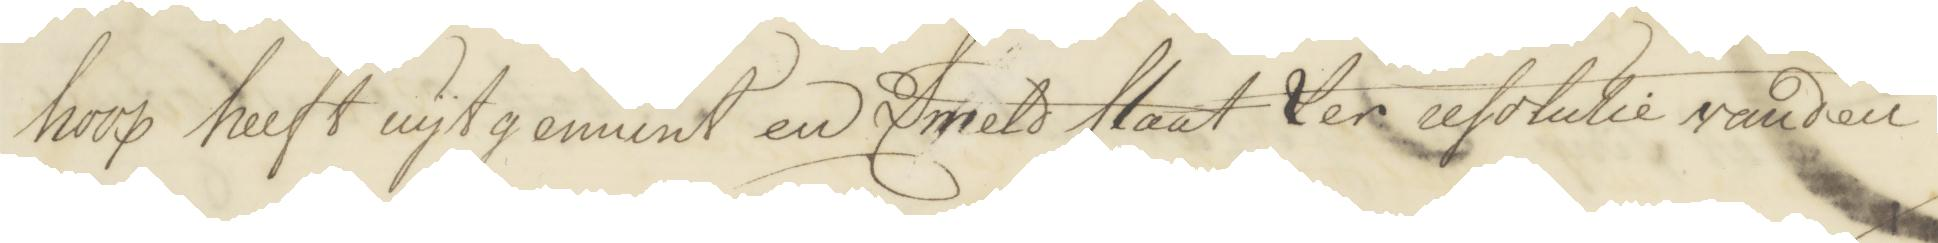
hoop heeft uijtgemunt en vermeld staat ter resolutie van den
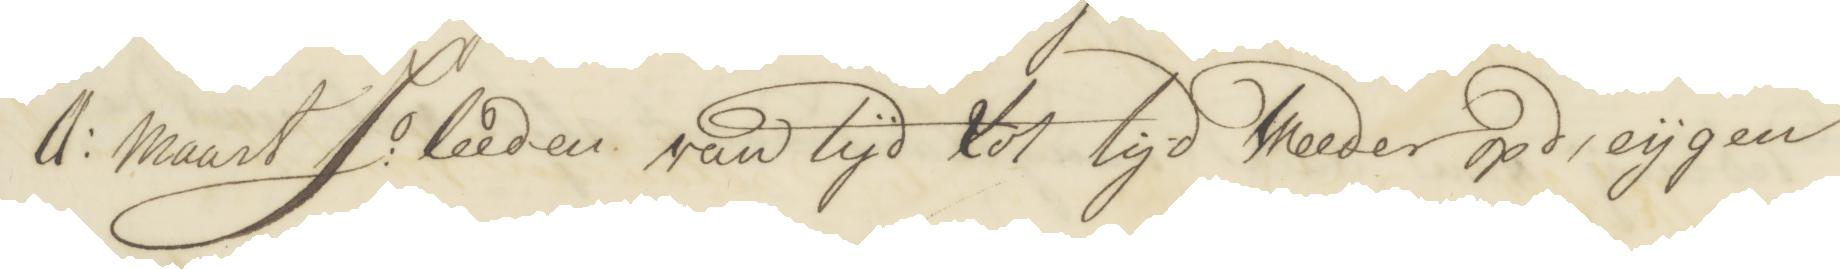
4: maart J:o leeden van tijd tot tijd weeder op deijgen
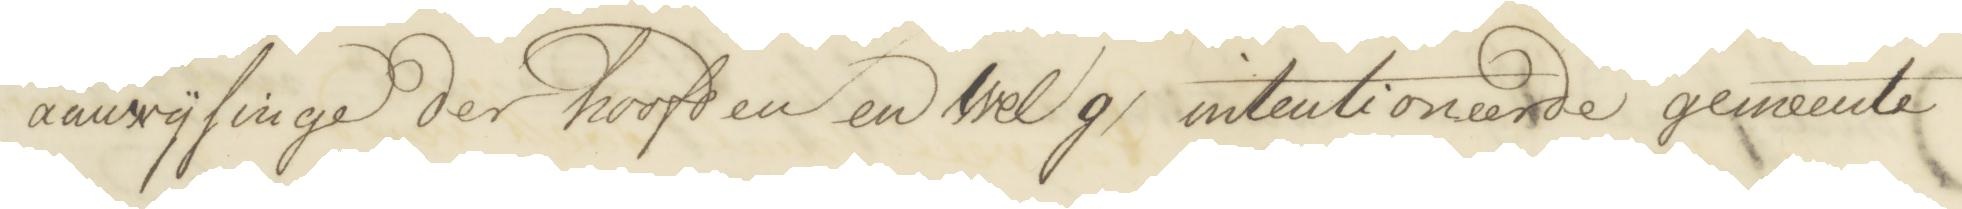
aanwijsinge der hoofden en wel gintentioneerde gemeente
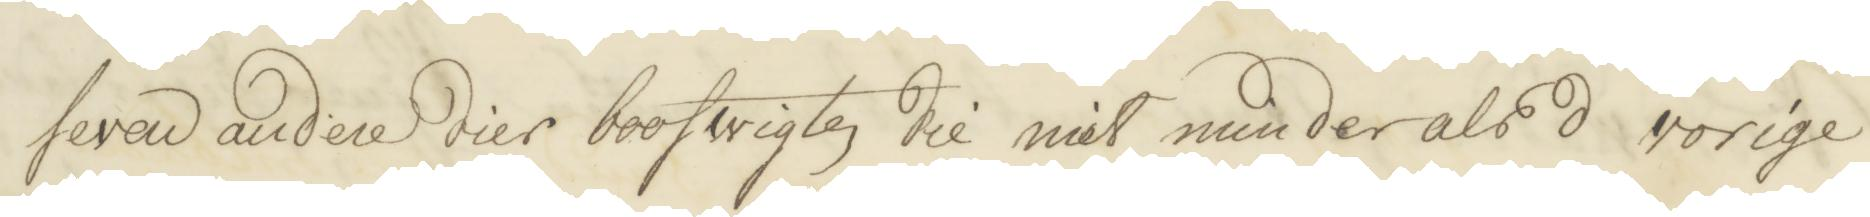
seven andere dier booswigten die niet minder als d vorige
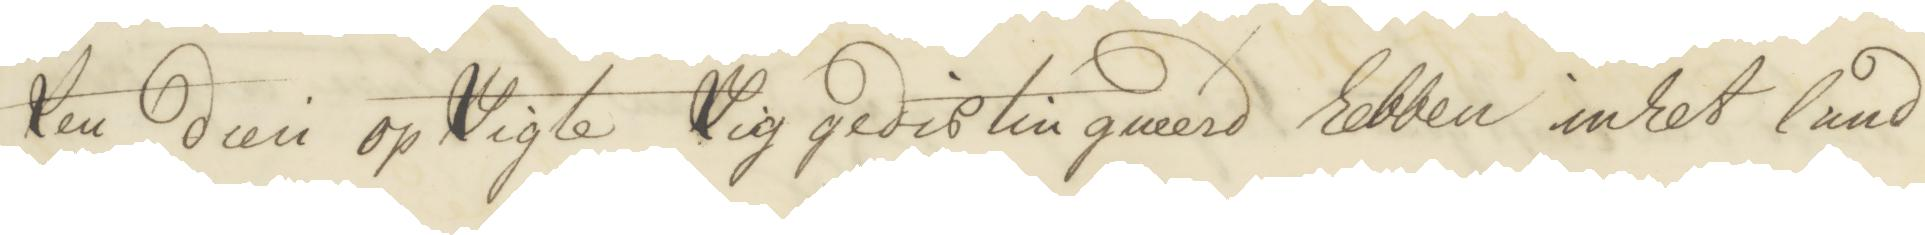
ten dien op zigte zig gedistingueerd hebben inhet land
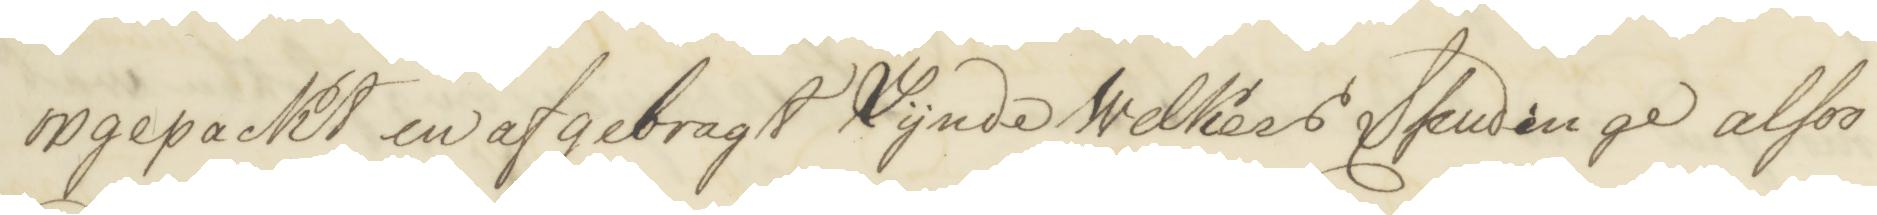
opgepackt en afgebragt zijnde, welkers versendinge alsoo
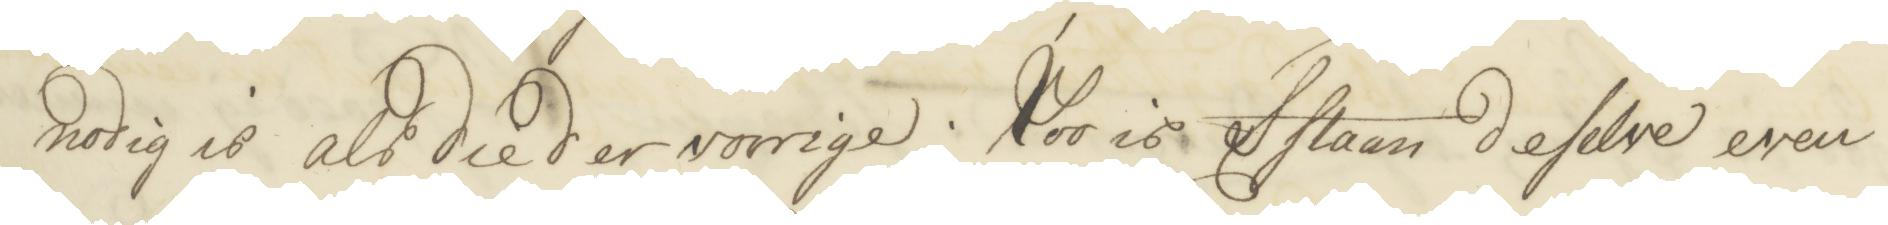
nodig is als die der voorige; zoo is verstaen deselve even
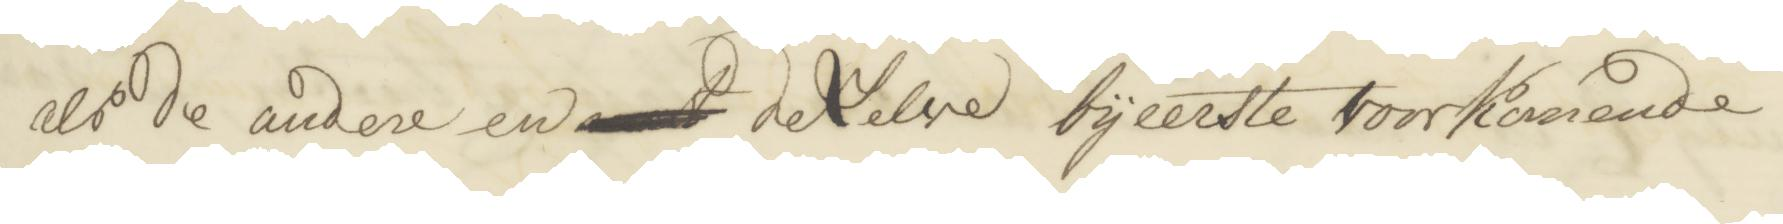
als de andere en met dezelve bij eerste voorkomende
